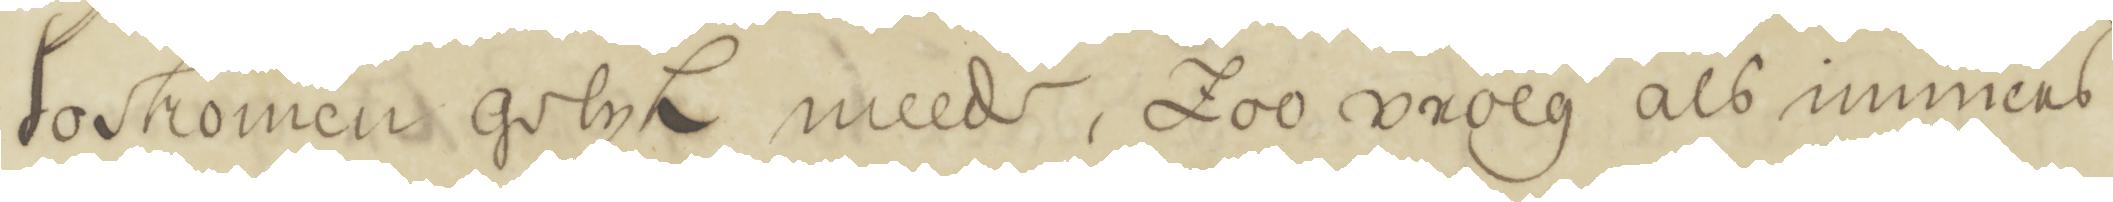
toekomen gelyk meede, Zoo vroeg als immers
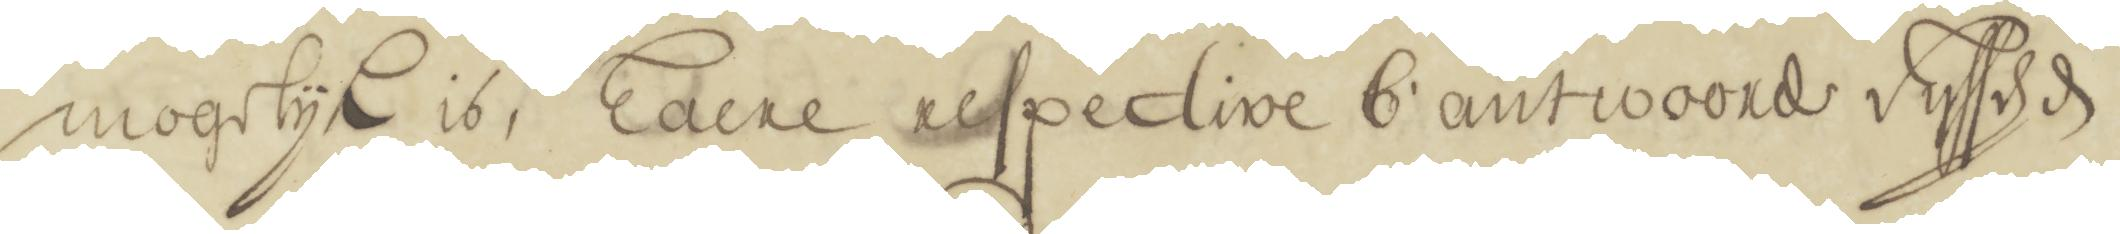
mogelijk is, haere respective b' antwoorde Eysschen
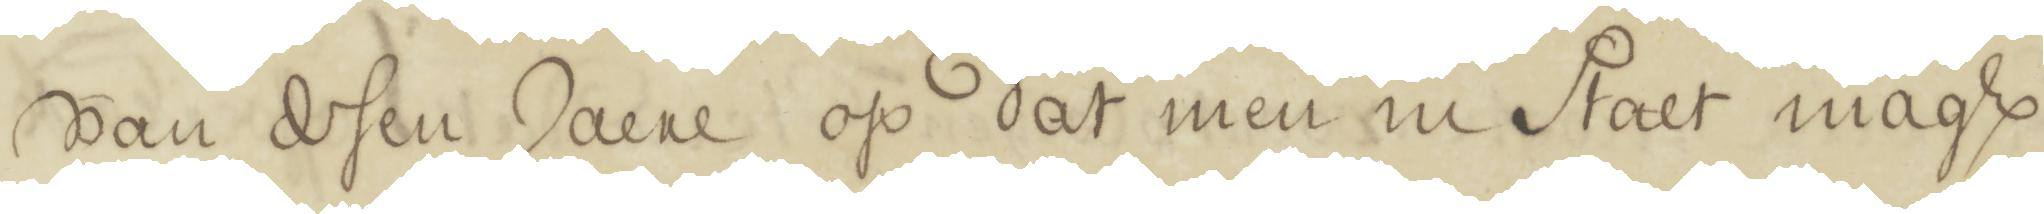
van desen Jaere op dat men in Staet magh
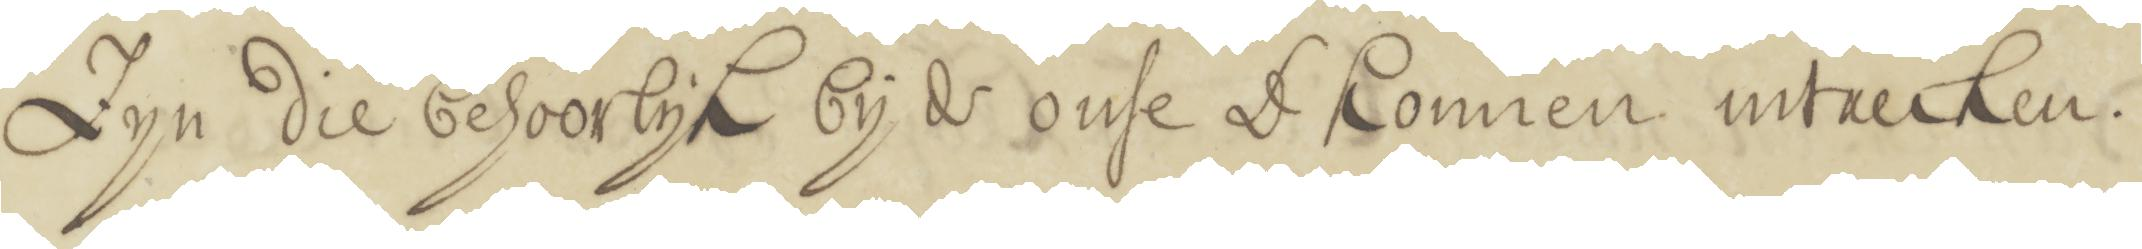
Zyn die behoorlijk bij de onse te konnen intrecken.
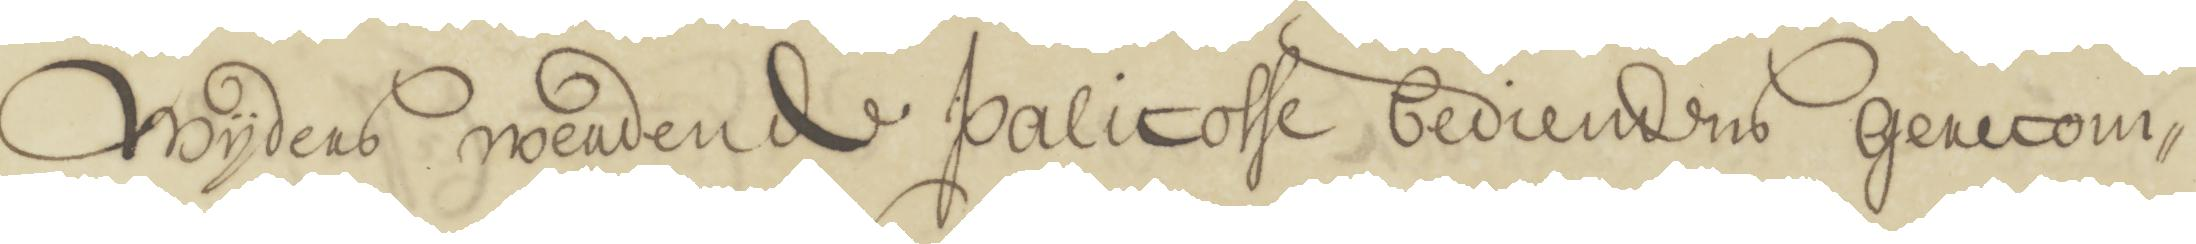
Wijders werden de palicosse bediendens gerecom„
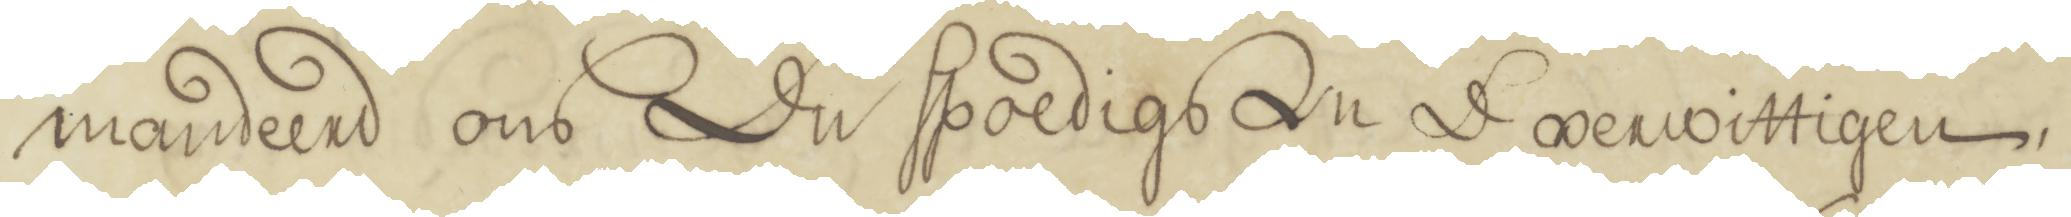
mandeerd ons ten spoedigsten te verwittigen,
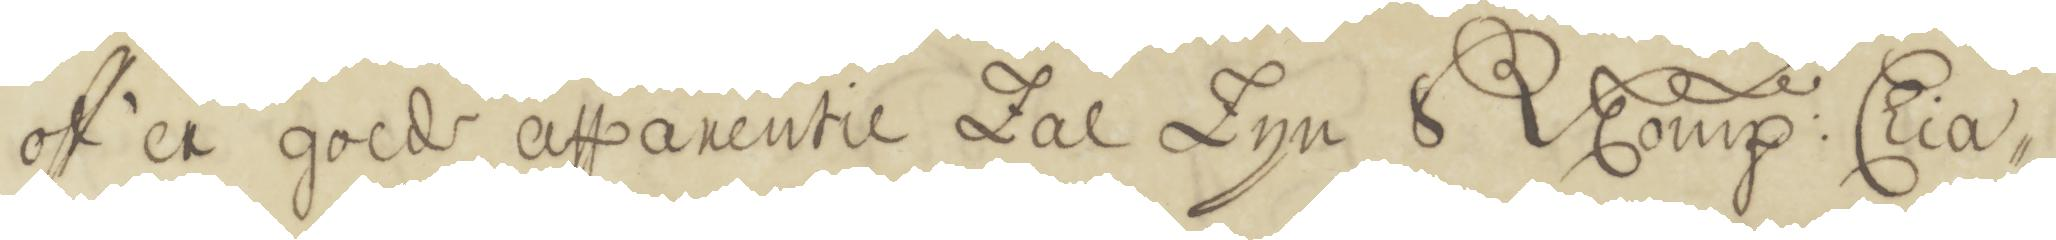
off er goede apparentie Zal Zyn s EComp: Chia„
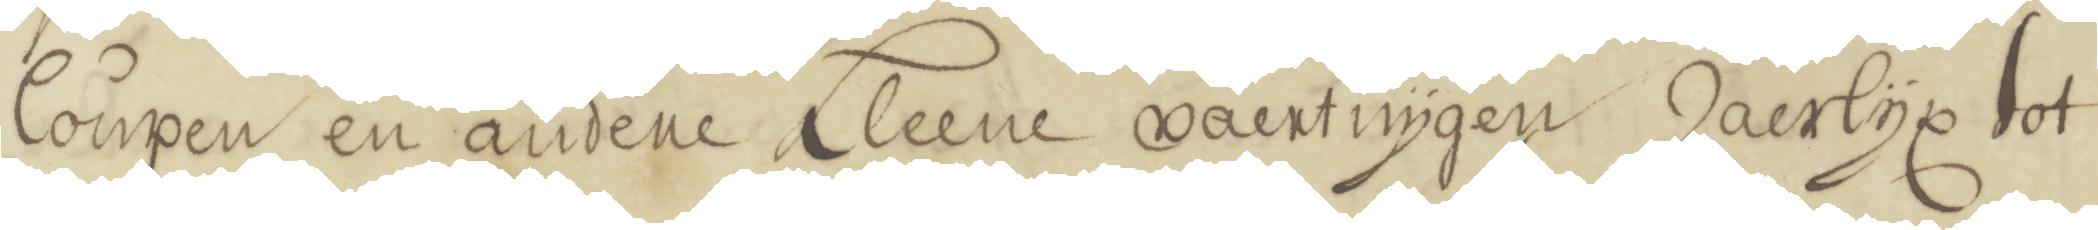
loupen en andere kleene vaertuijgen Jaerlijx tot
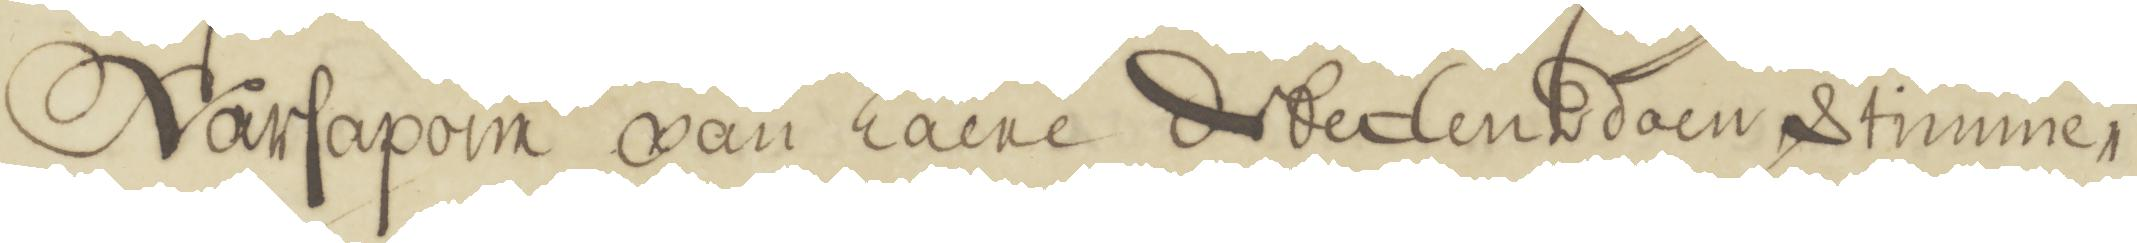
Narsapour van haere defecten te doen vertimme„
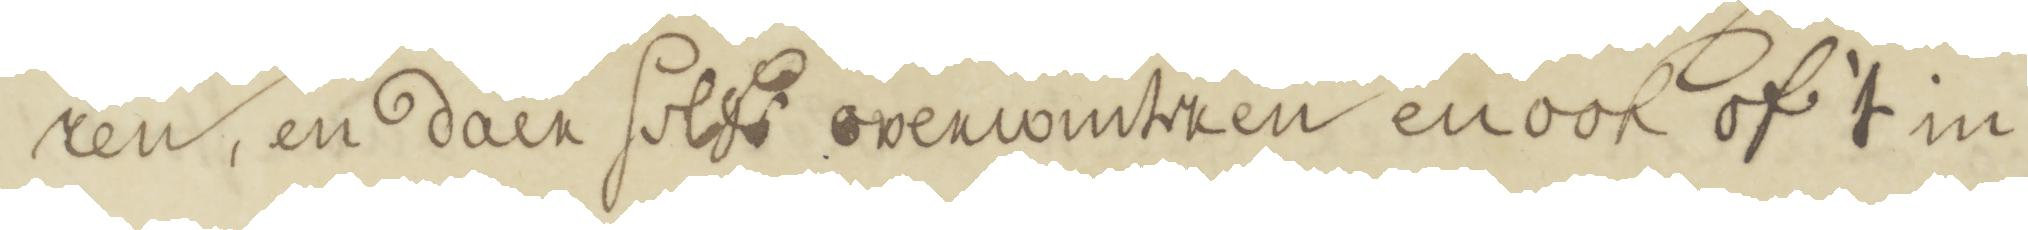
ren, en daer selfs overwinteren en ook of ’t in
